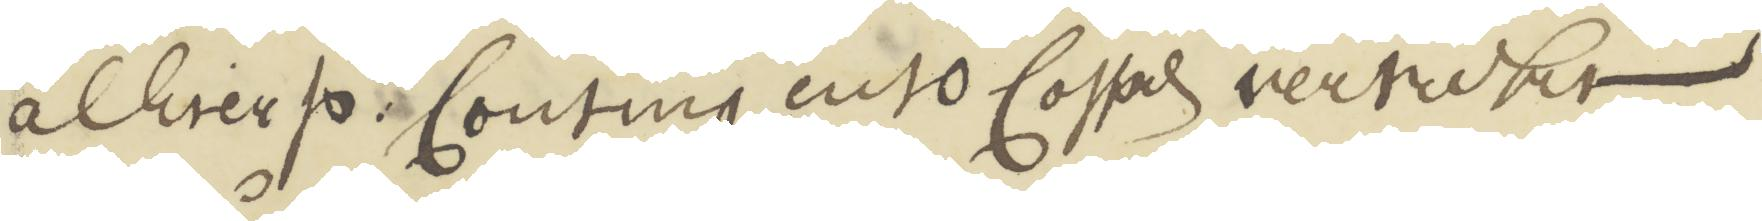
alhier p:r conting en 10 coppen vertrekt
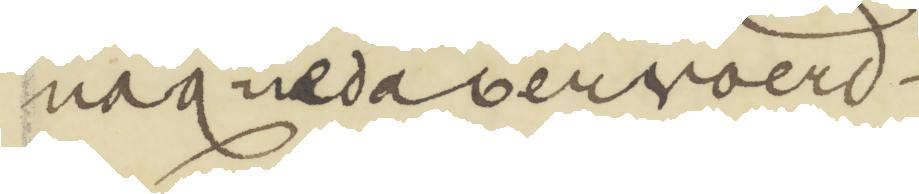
na queda vervoerd
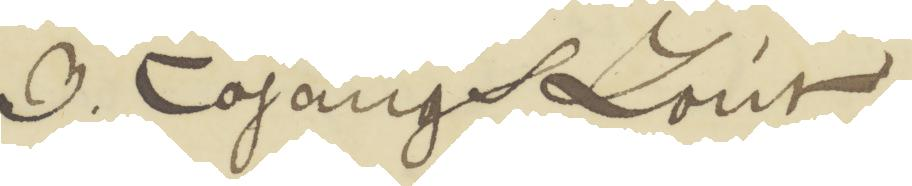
3. cojange zout
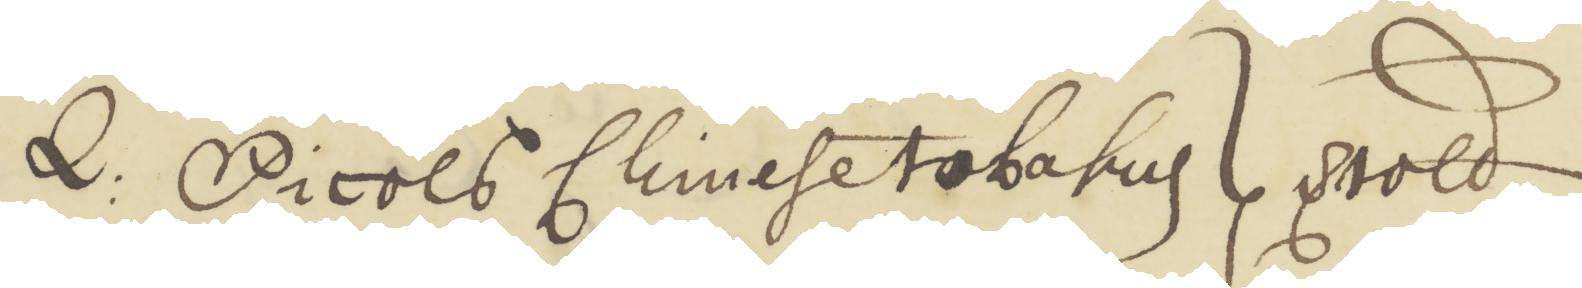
2: picols chinese tobaken vertold
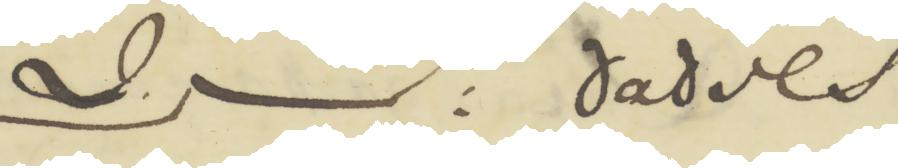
2. _:o dadels
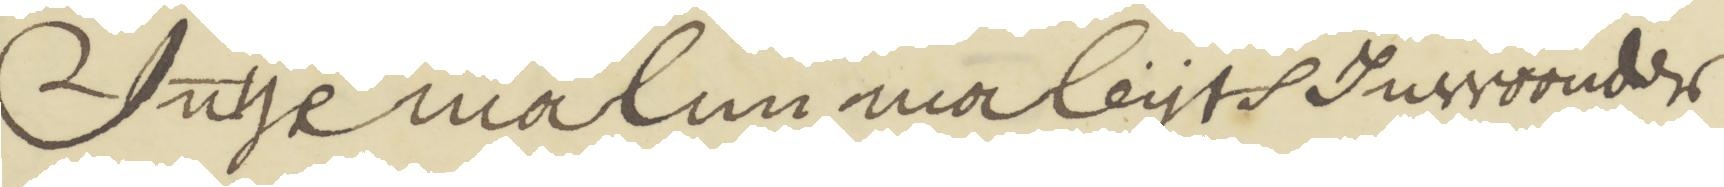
6 _:o Jntje malim maleijts jnwoonder
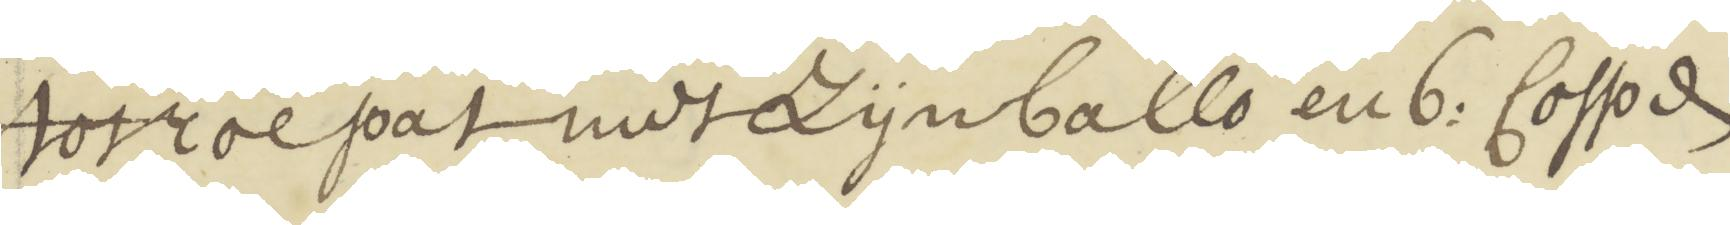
tot roepat met zijn ballo en 6: coppen
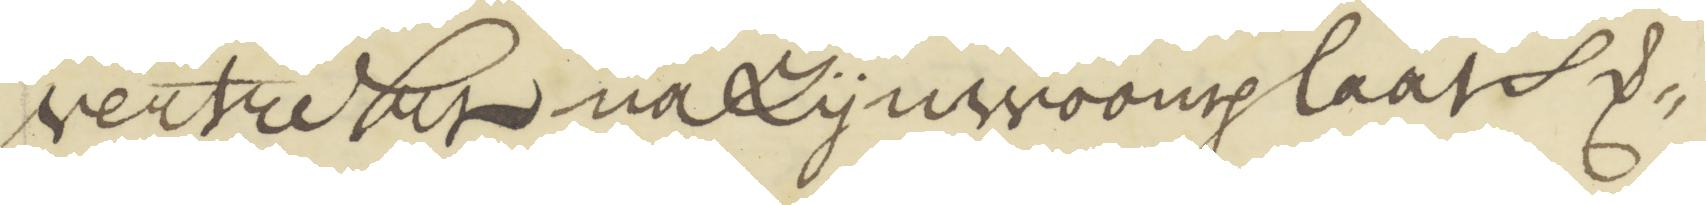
vertrekt na zijn woonplaats ver„
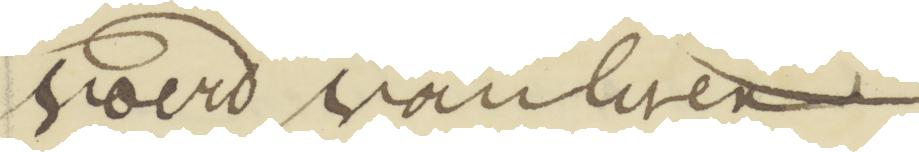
voerd van hier
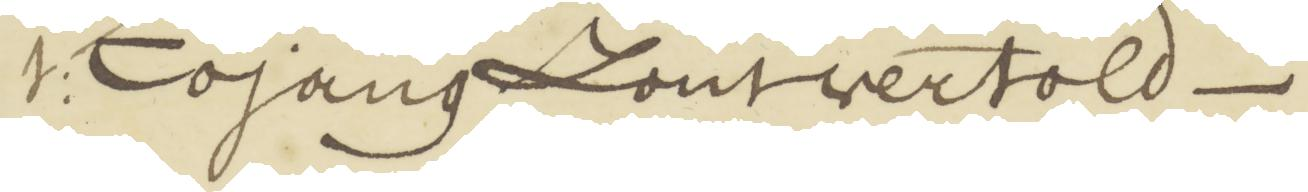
1: cojang zout vertold
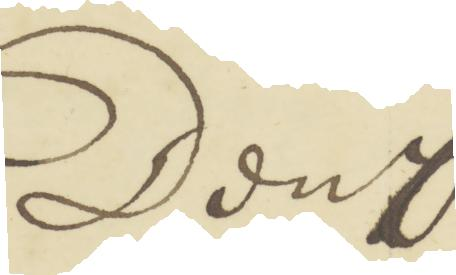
Den 6
